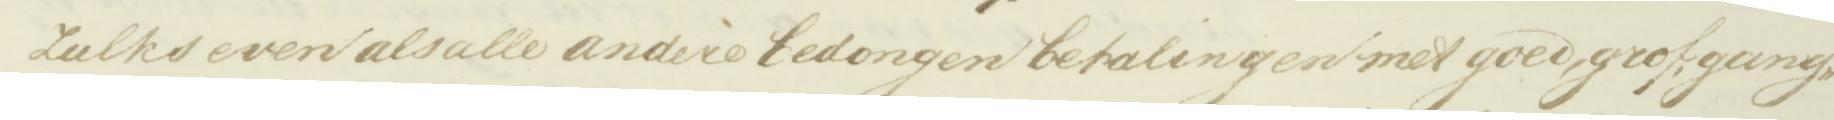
zulks even als alle andere bedongen betalingen met goed, grof gang
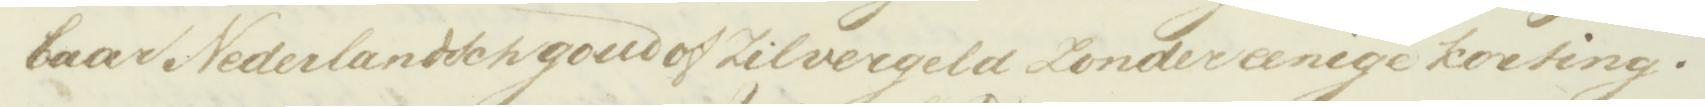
baar Nederlandsch goud of zilvergeld zonder eenige korting.
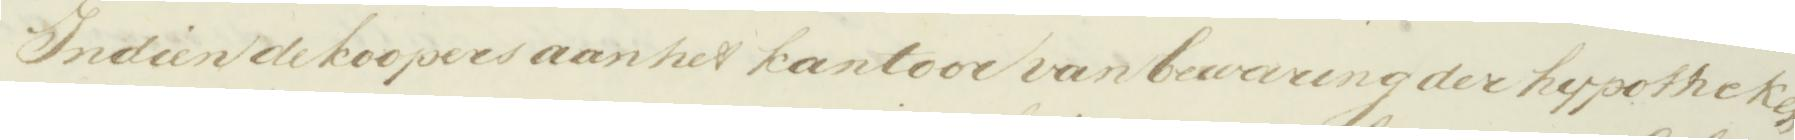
Indien de koopers aan het kantoor van bewaring der hypotheken,
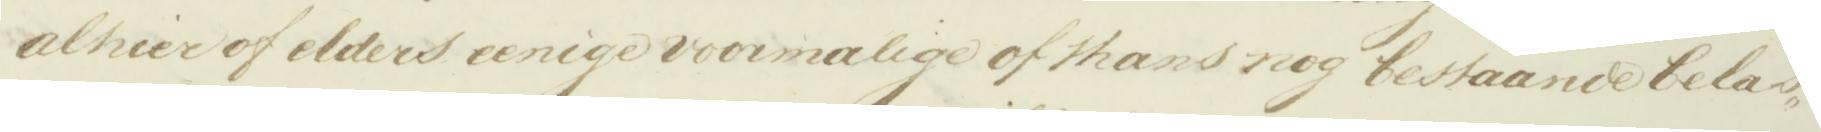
alhier of elders eenige voormalige of thans nog bestaande belas„
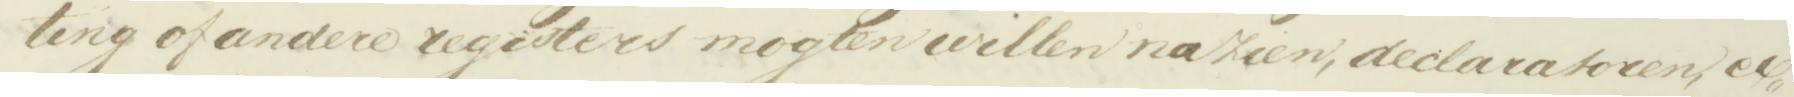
ting of andere registers mogten willen na zien, declaratoren, ex
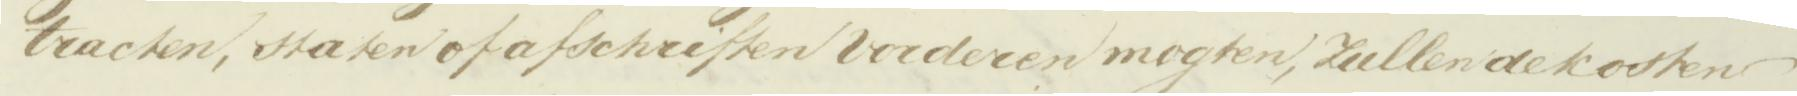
tracten, staten of afschriften vorderen mogten, zullen de kosten
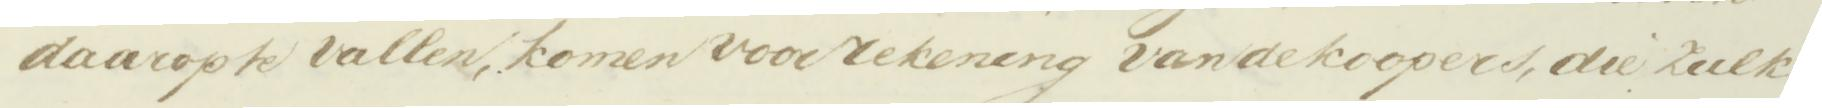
daarop te vallen, komen voor rekening van de koopers, die zulks
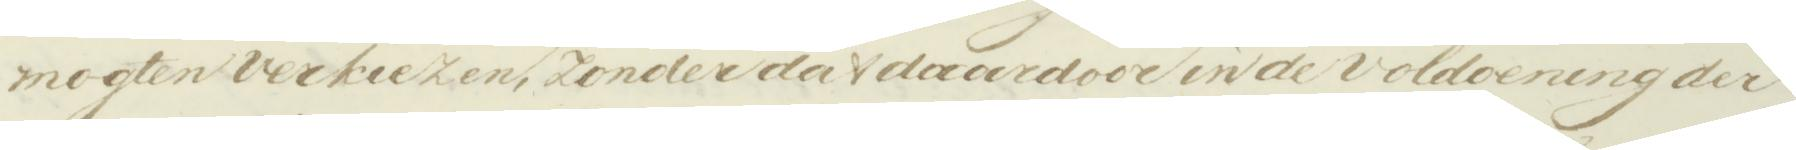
mogten verkiezen, zonder dat daardoor in de voldoening der
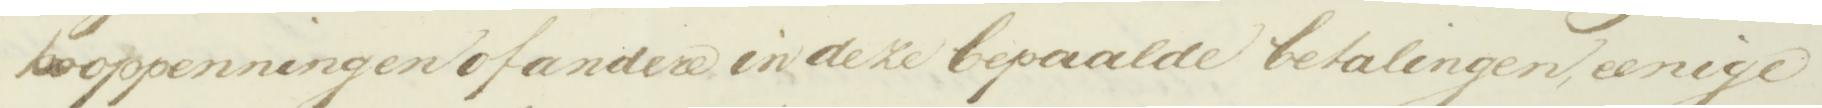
kooppenningen of andere in deze bepaalde betalingen, eenige
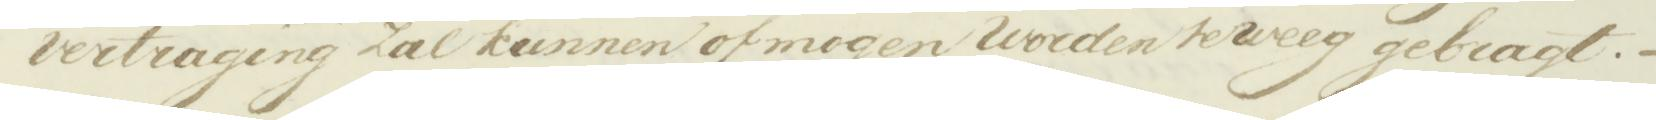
vertraging zal kunnen of mogen worden teweeg gebragt.-
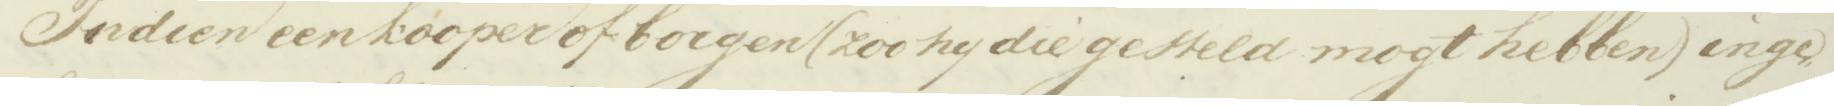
Indien een kooper of borgen (zoo hy die gesteld mogt hebben) in ge„
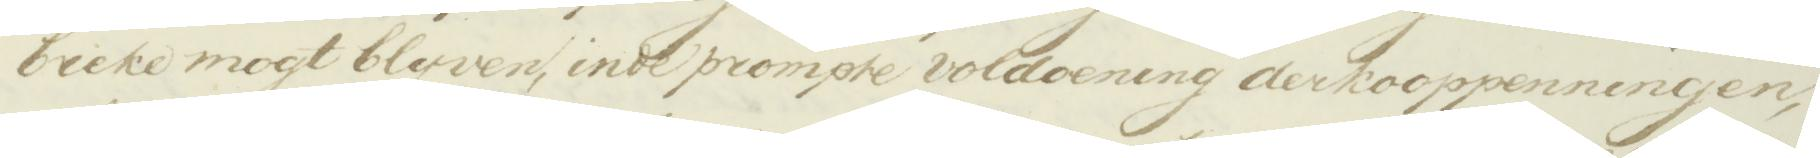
breke mogt blyven, inde prompte voldoening der kooppenningen,
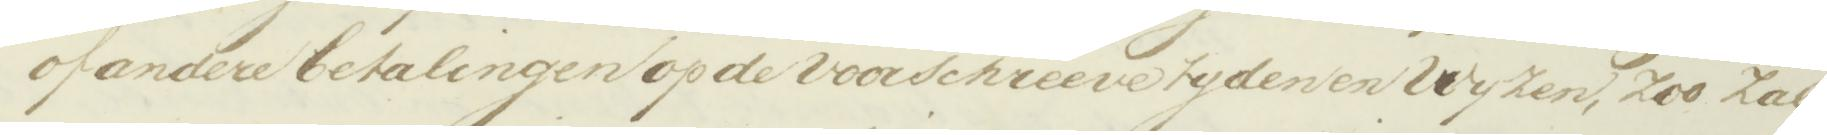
of andere betalingen op de voorschreeve tyden en wyzen, zoo zal
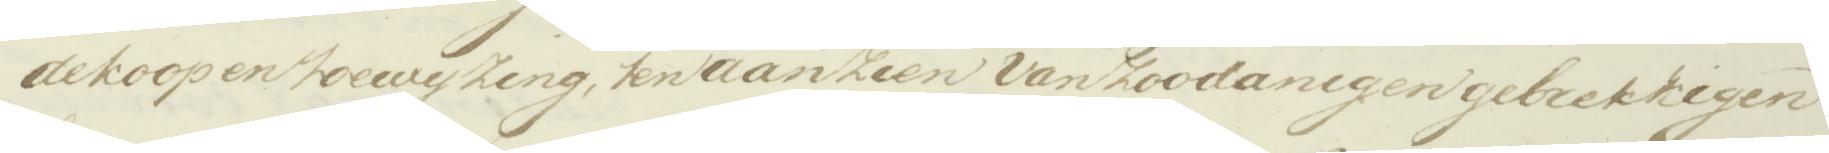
de kooper toewyzing, ten aanzien van zoodanigen gebrekkigen
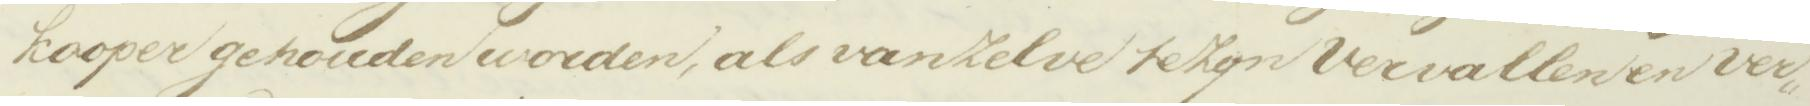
kooper gehouden worden, als vanzelve te zijn vervallen en ver„
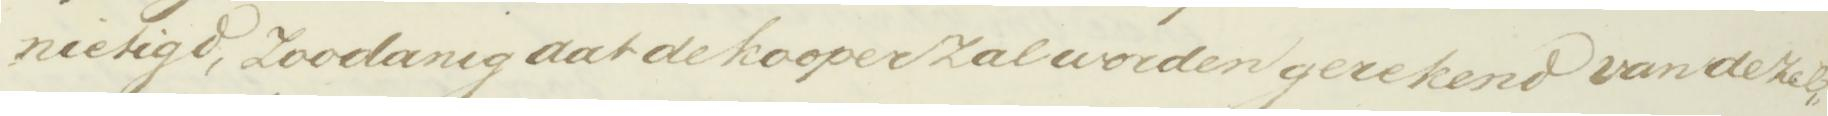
nietigd, zoodanig dat de kooper zal worden gerekend van dezel„
